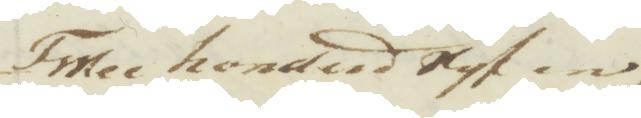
Twee honderd vyf en
